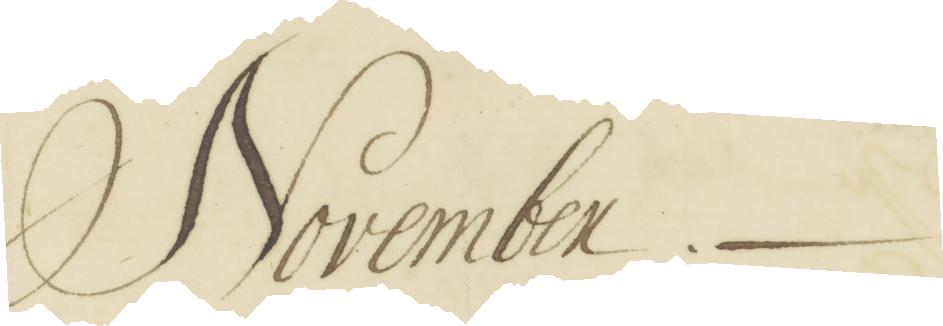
November. —
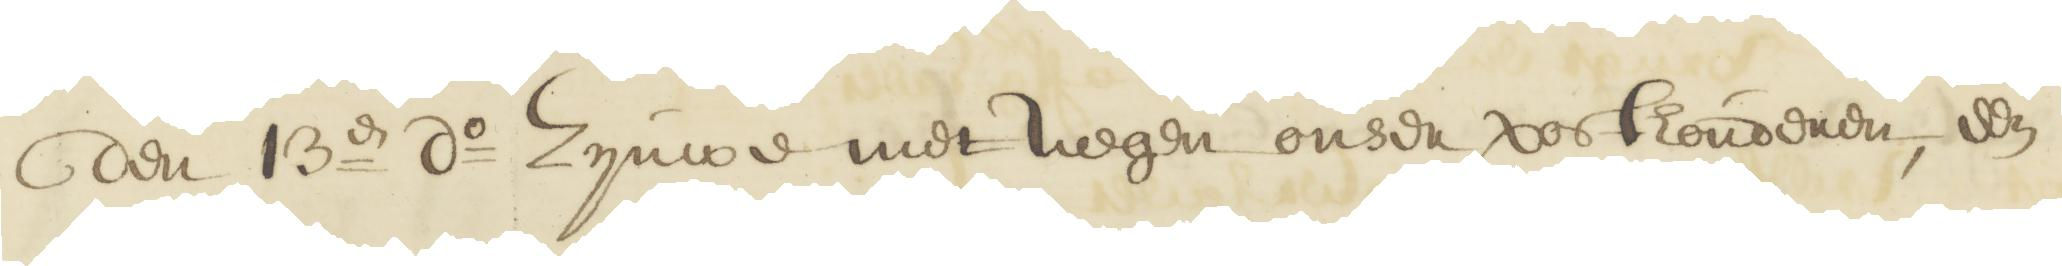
den 13=en d=o zijn we met wegen onser posthouderen, een
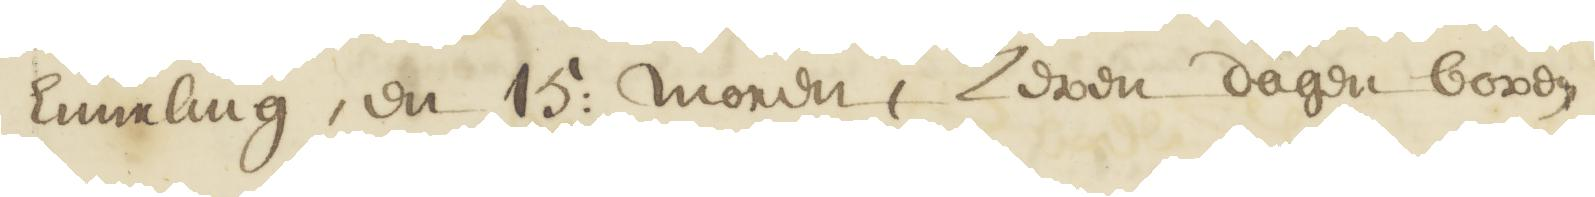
huurling, en 15: moren, zeven dagen boven
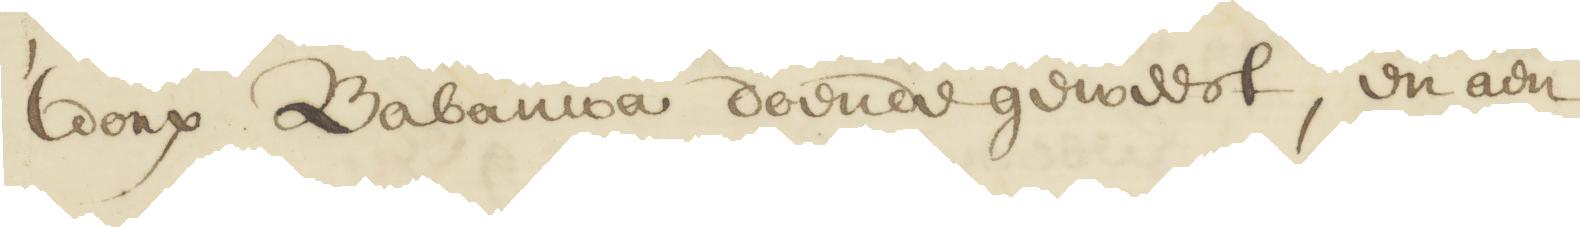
'tdorp Babauwa doende geweest, en aen
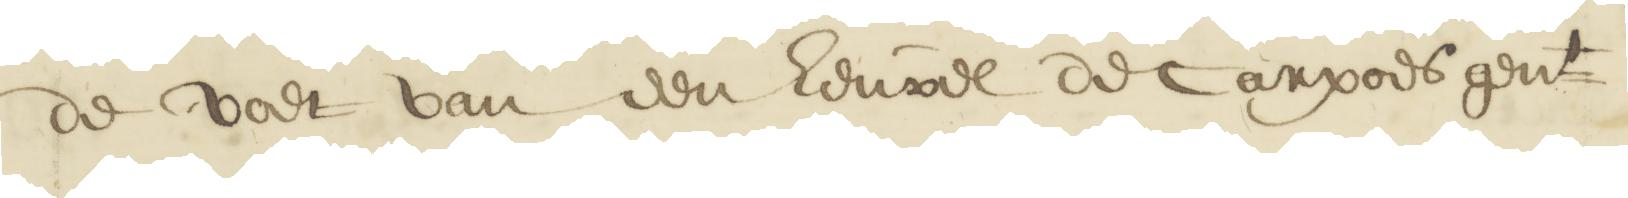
de voet van een heuvel de carpoes gen=t
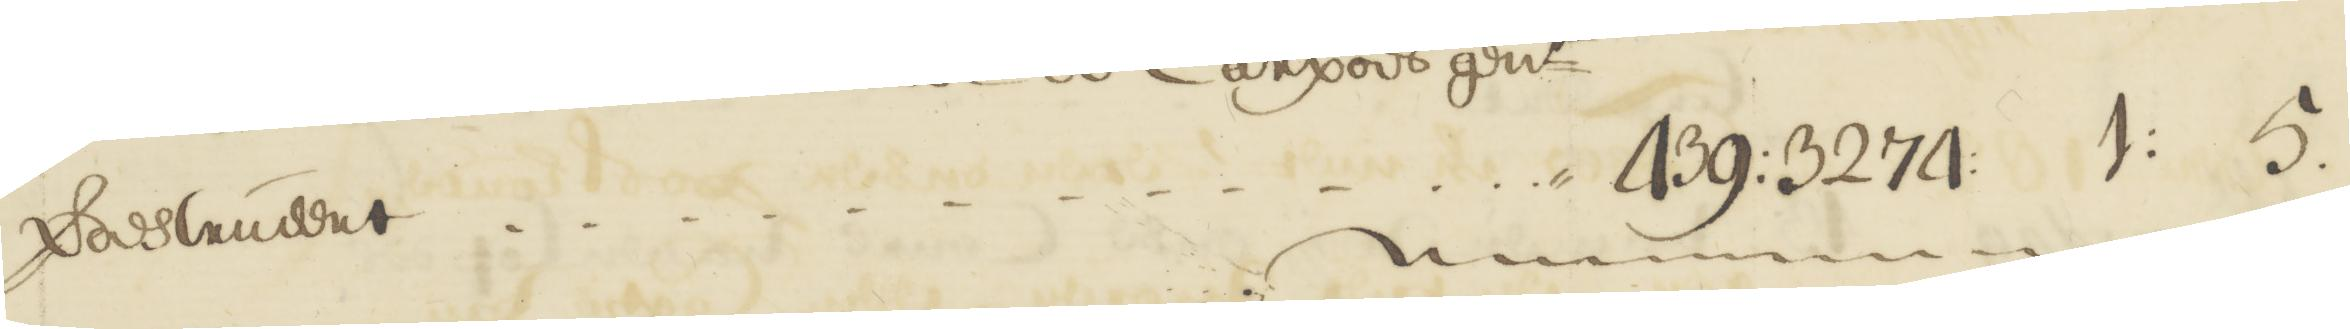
verdestrueert . . . . . - - - - - . . .„ 439: 3274: 1: 5.
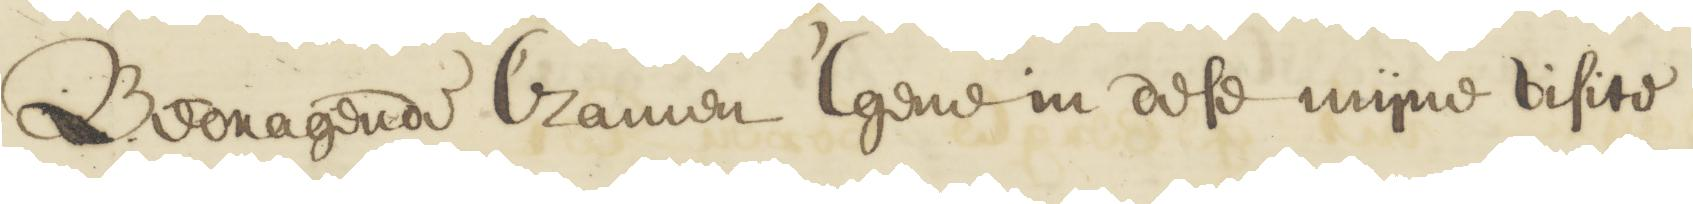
Bedragende t'zamen 'tgene in dese mijne visite
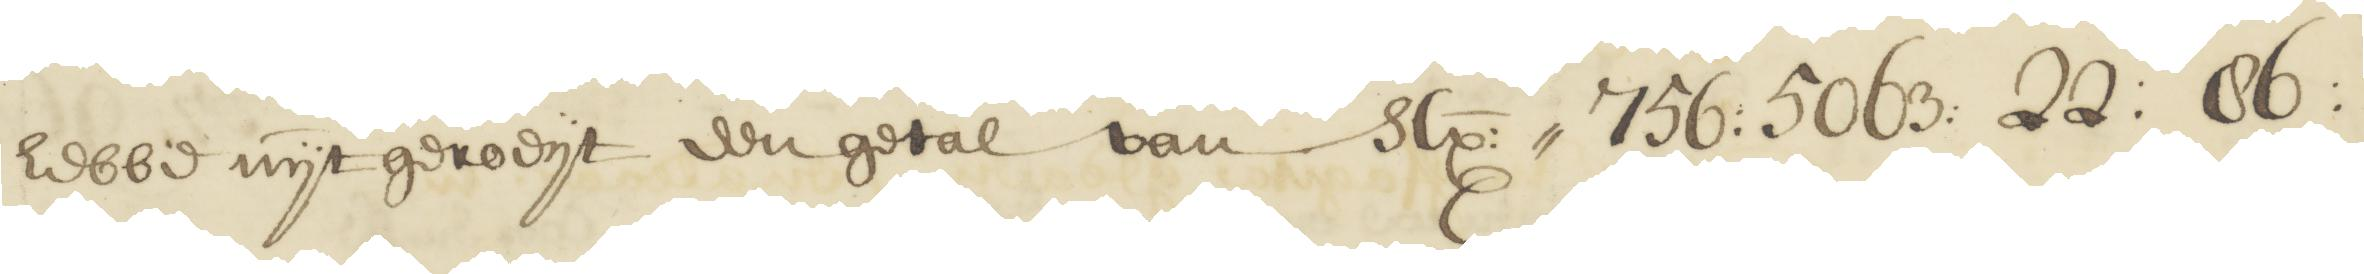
hebbe uijt geroeijt een getal van stx: „ 756: 5063: 22: 86:
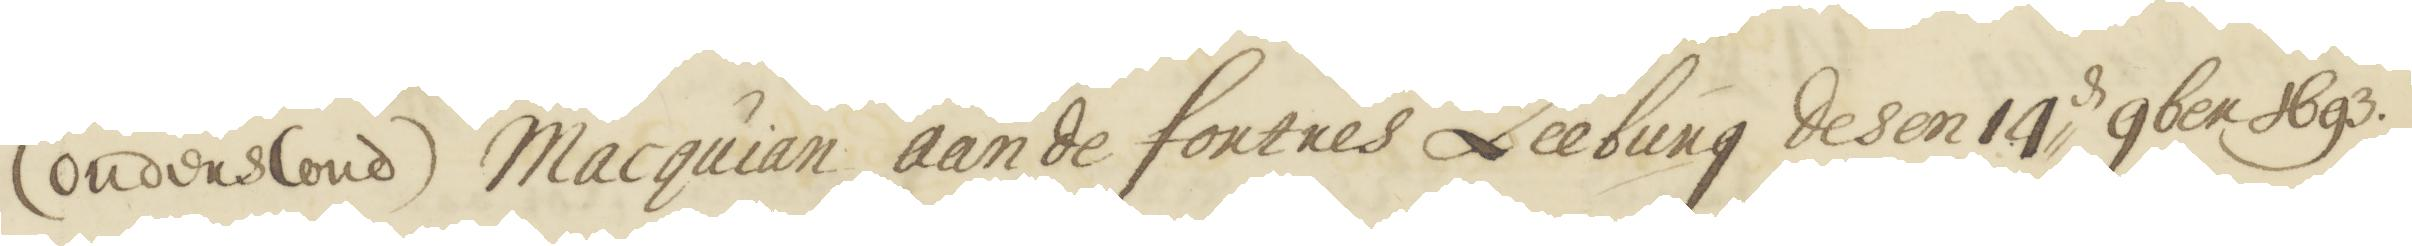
(onderstond) Macquian aan de fortres zeeburg desen 14„en 9ber 1693.
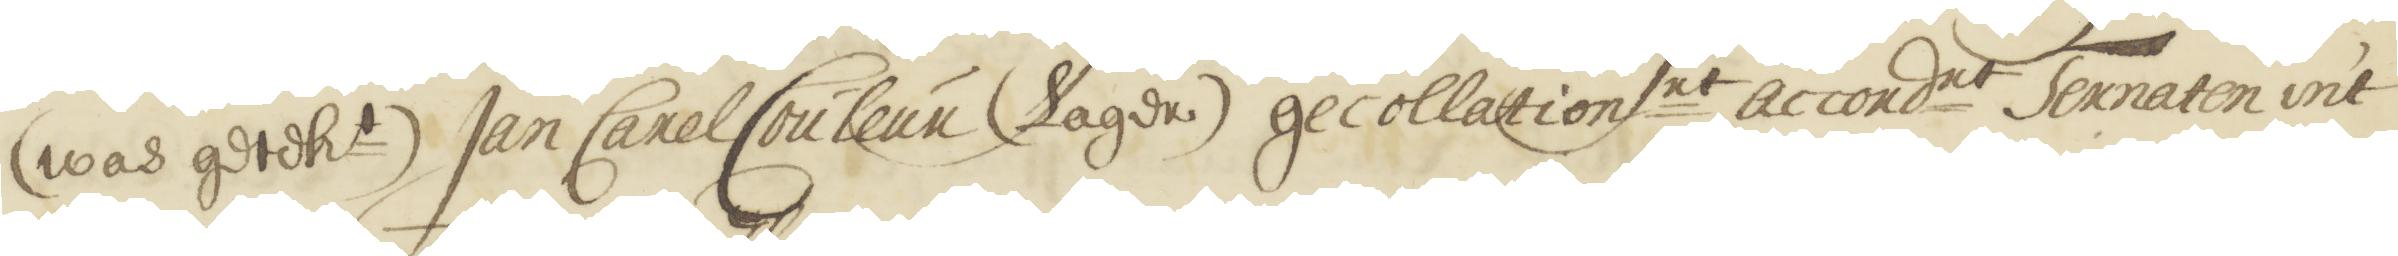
(was getek=t) Jan Carel Couleur (lager) gecollation=rt accord=rt Ternaten in’t
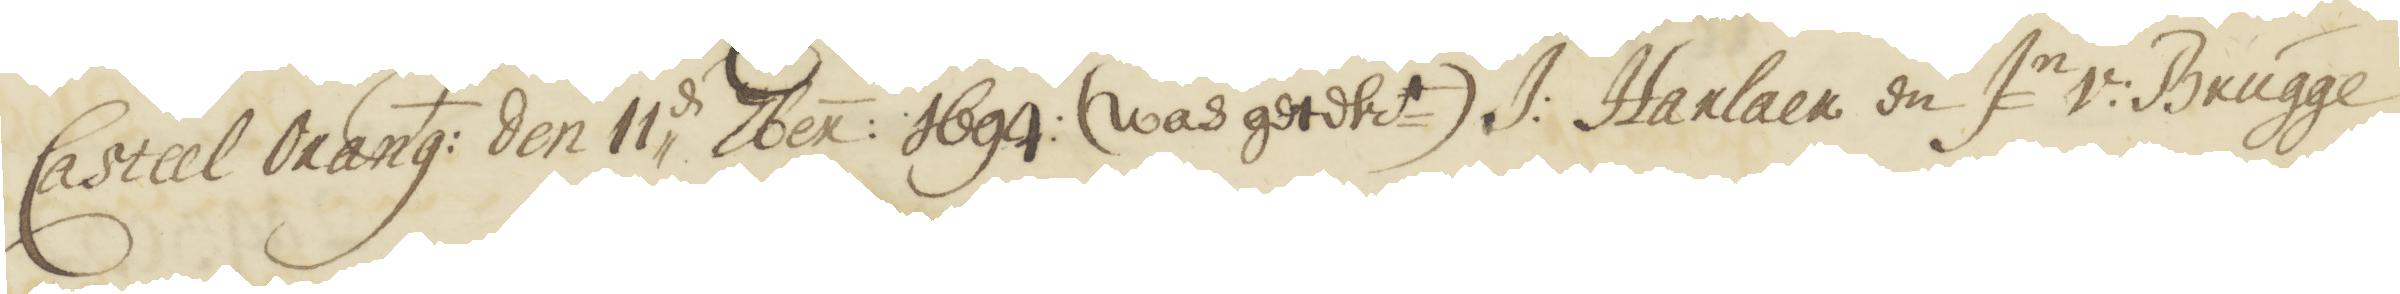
Casteel Orang: den 11„en 7ber: 1694: (was getek=t) I: Harlaer en J=n v: Brugge
